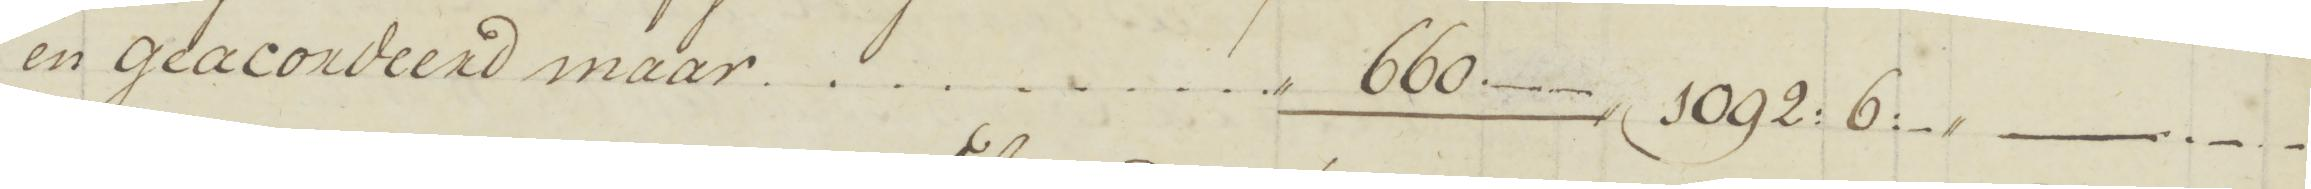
en geacordeerd maar . . . . . . . . . .„ 660.– – „ 1092: 6:–„ — . – . –
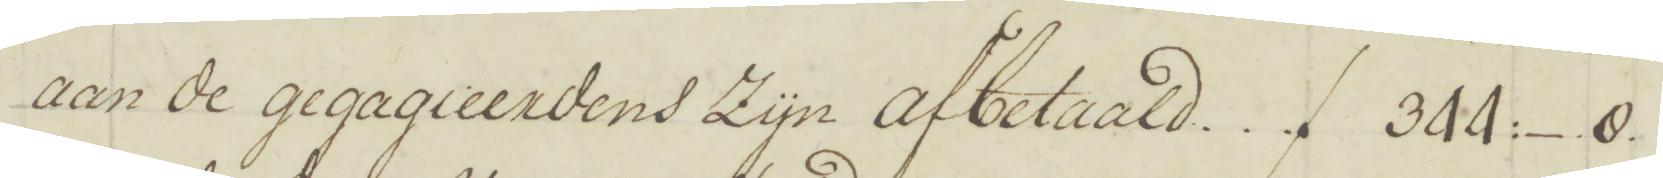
aan de gegagieerdens zijn afbetaald ... ƒ 344:-8.
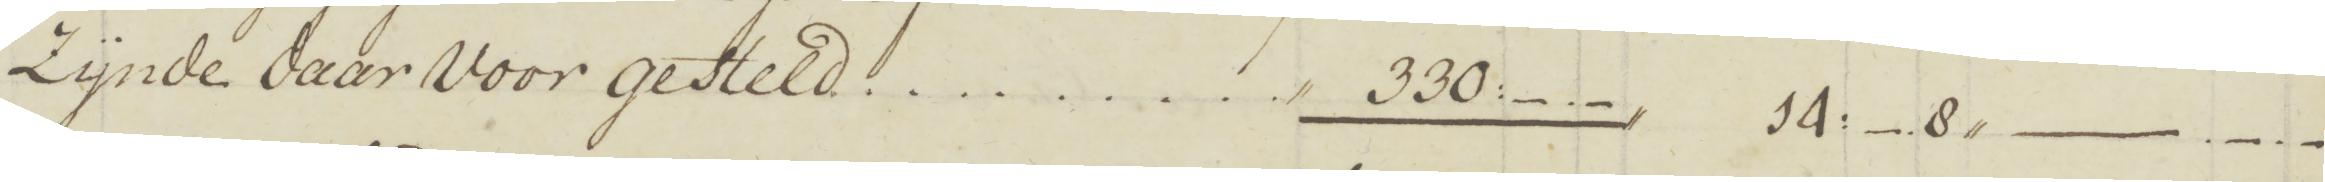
zijnde daar voor gesteld . . . . . . . . . „ 330: – . – „ 14: –. 8„ — . – . –
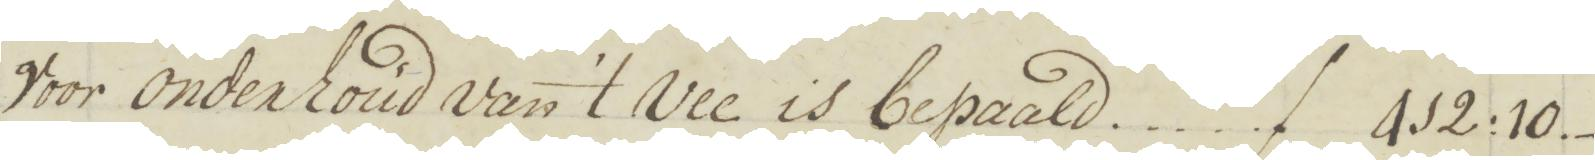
voor onderhoud van ’t vee is bepaald . . . . . ƒ 412: 10.–
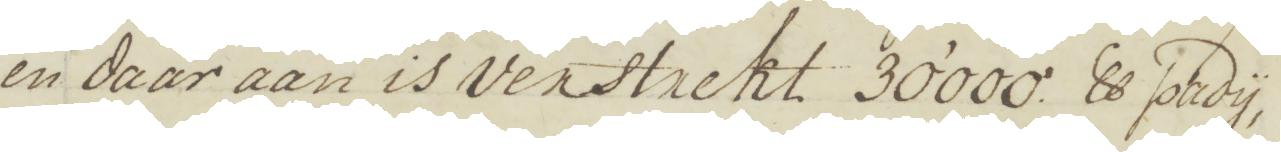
en daar aan is verstrekt 30'000. lb padij,
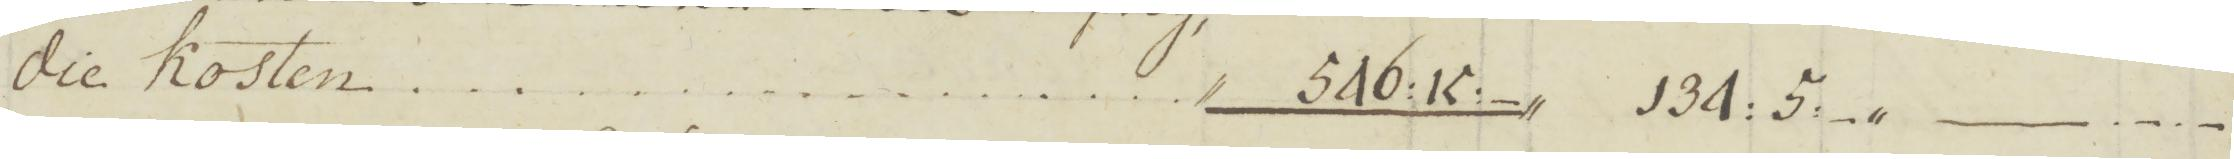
die kosten . . . . . . . . . . . . . . . . . . „ 546:15:–„ 134: 5:–„ —. – . –
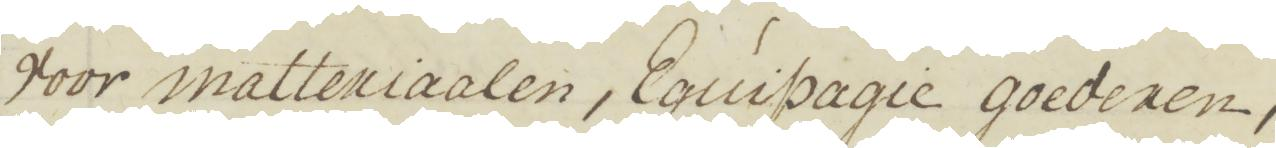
voor matteriaalen, Equipagie goederen,
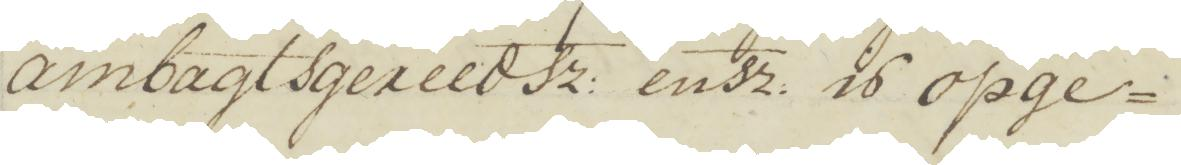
ambagtsgereedsz: ensz: is opge=
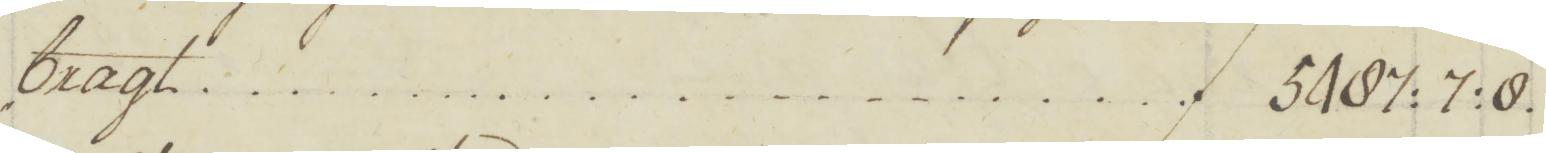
bragt . . . . . . . . . . . . . . - - - - . . . . . .ƒ 5487: 7: 8.
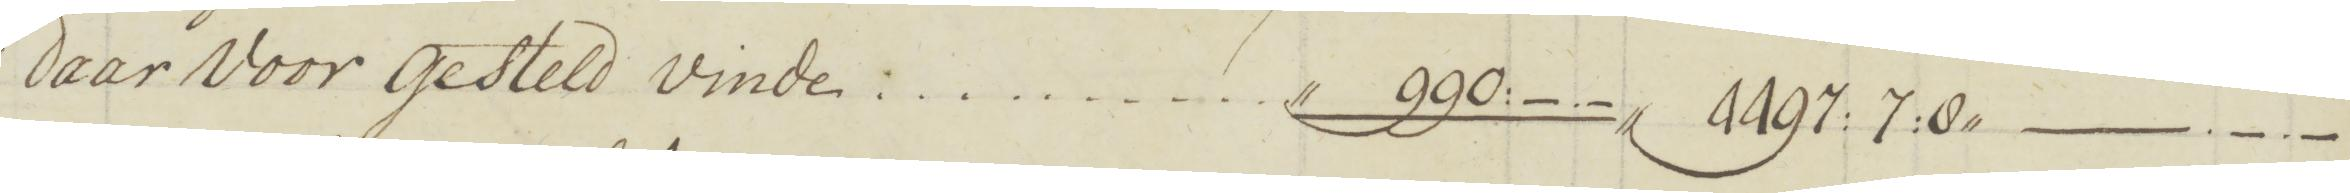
daar voor gesteld vinde . . . . . . - - . . „ 990: – . –„ 4497: 7:8„ — . – . –
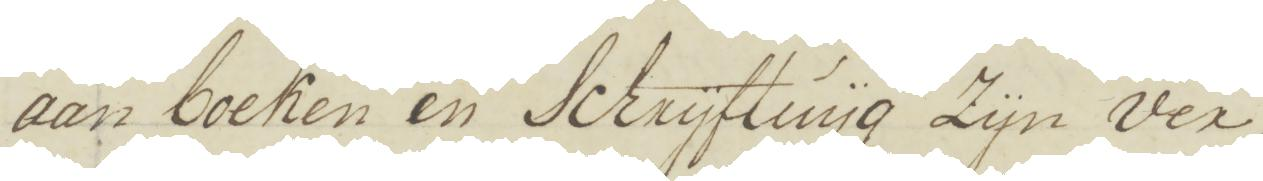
aan boeken en schrijftuijg zijn ver
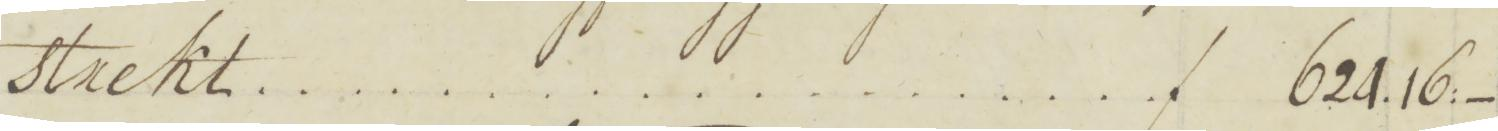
strekt . . . . . . . . . . . . . . . . . . . ƒ 624.16:–
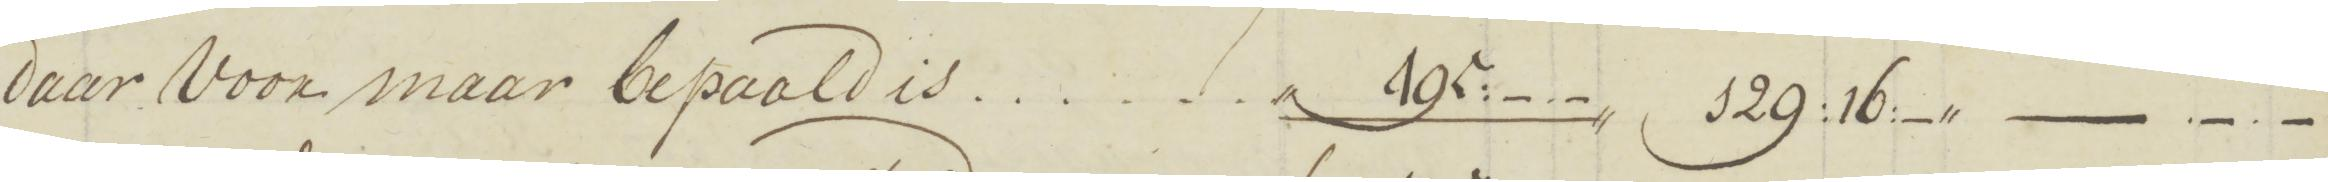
daar voor maar bepaald is . . . . . . „ 495: – . – „ 129:16:–„ — . – . –
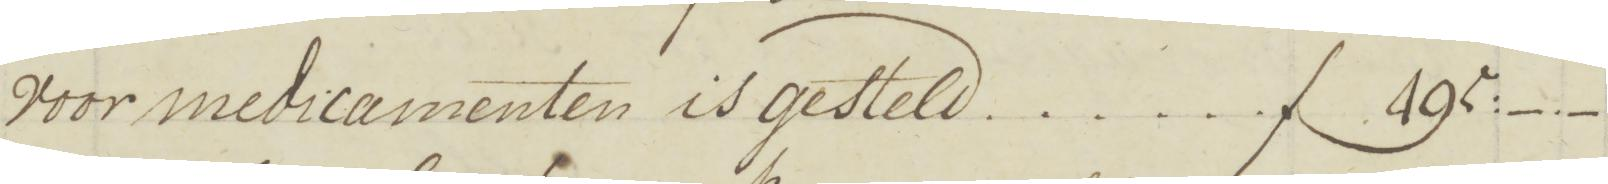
voor medicamenten is gesteld . . . . . . ƒ 495:– . –
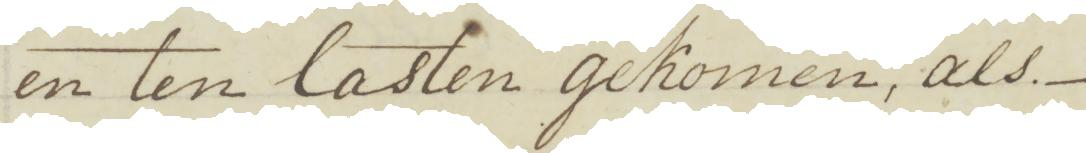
en ten lasten gekomen, als.–
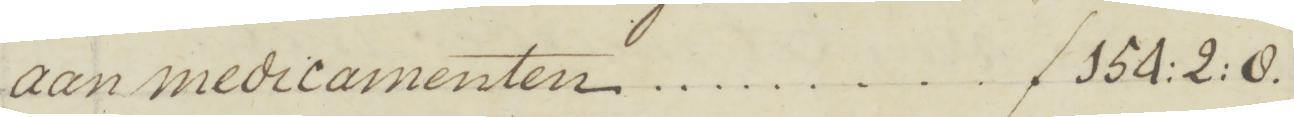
aan medicamenten . . . . . . . . . ƒ 154:2:8.
